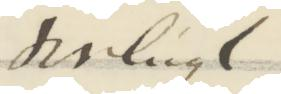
V vlugt
